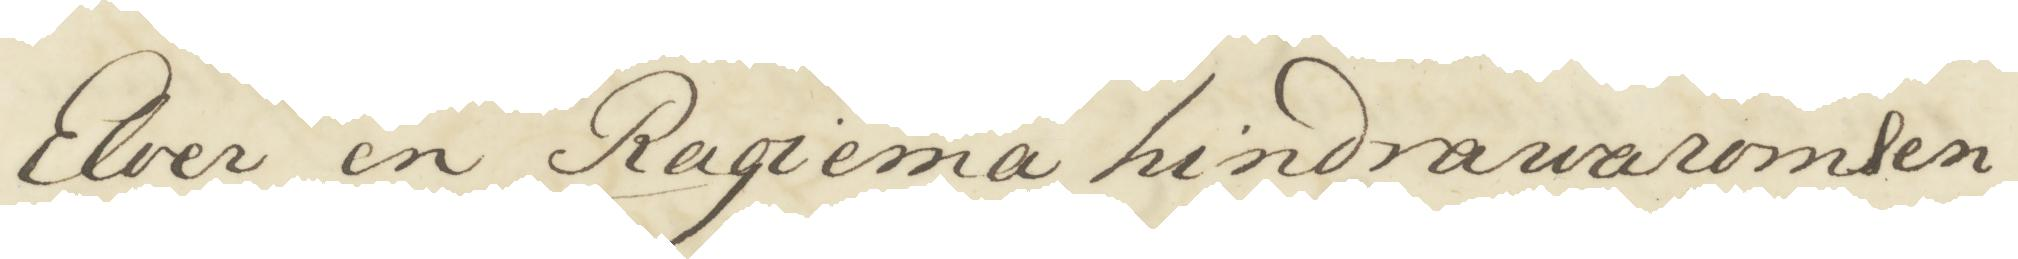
Elver en Ragiema hindrawaromsen
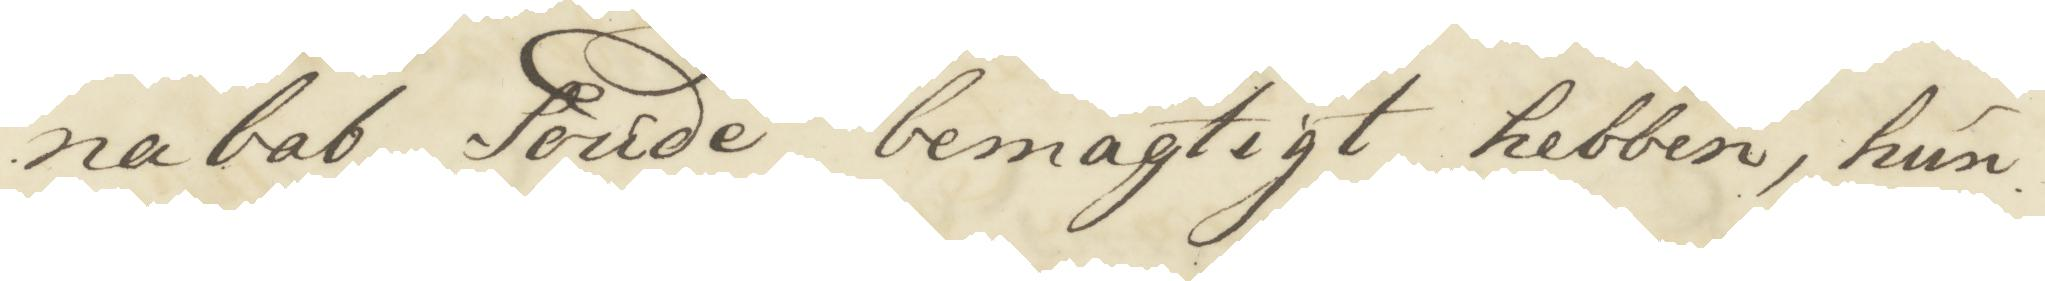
nabab soude bemagtigt hebben, hun
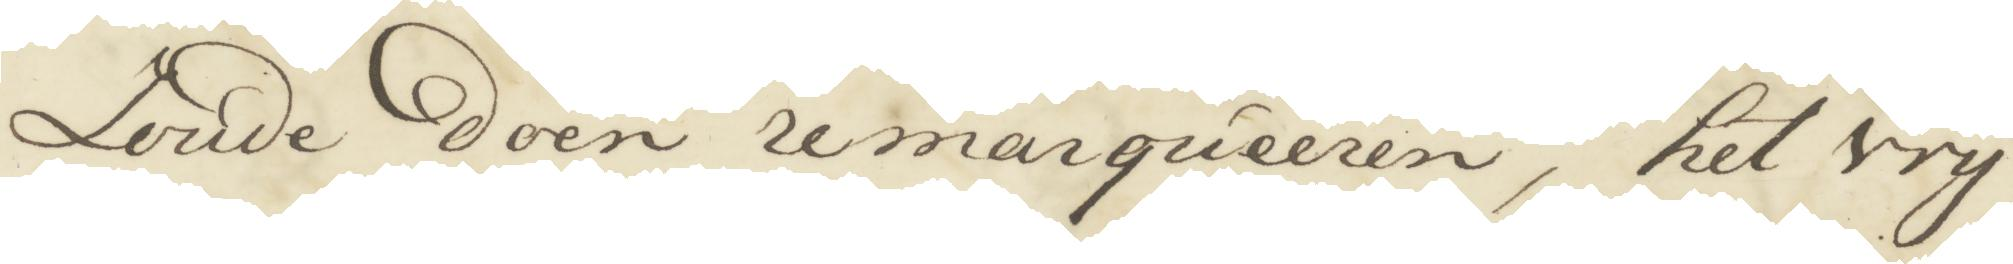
zoude doen remarqueeren, het vrij
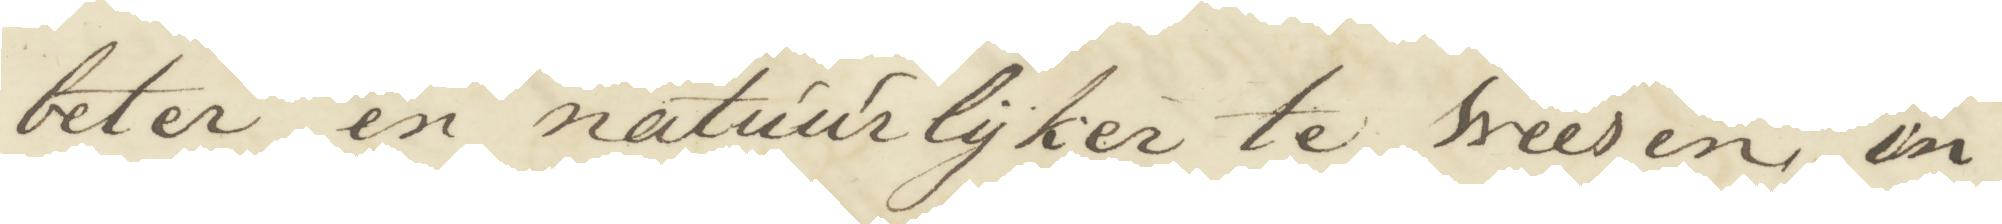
beter en natuurlijker te weesen, in
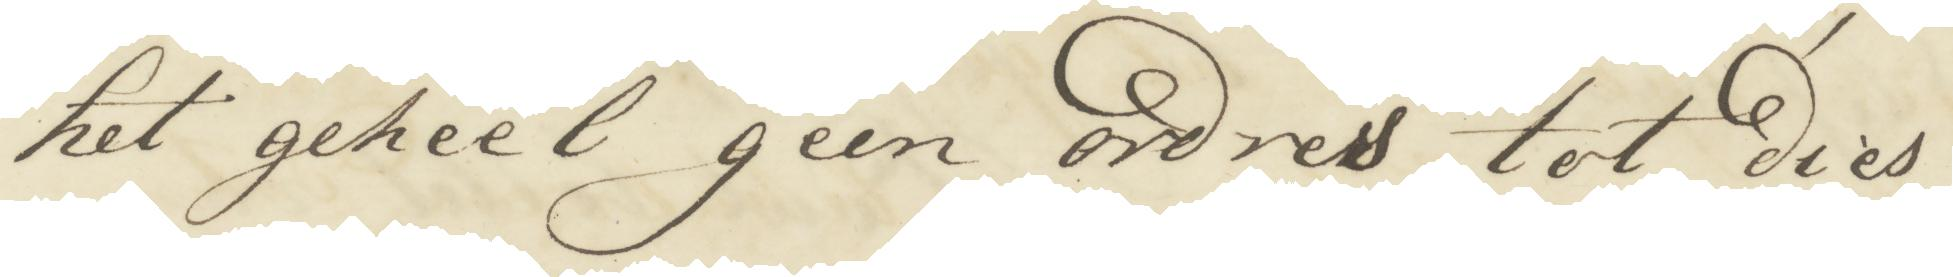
het geheel geen ordres tot dies
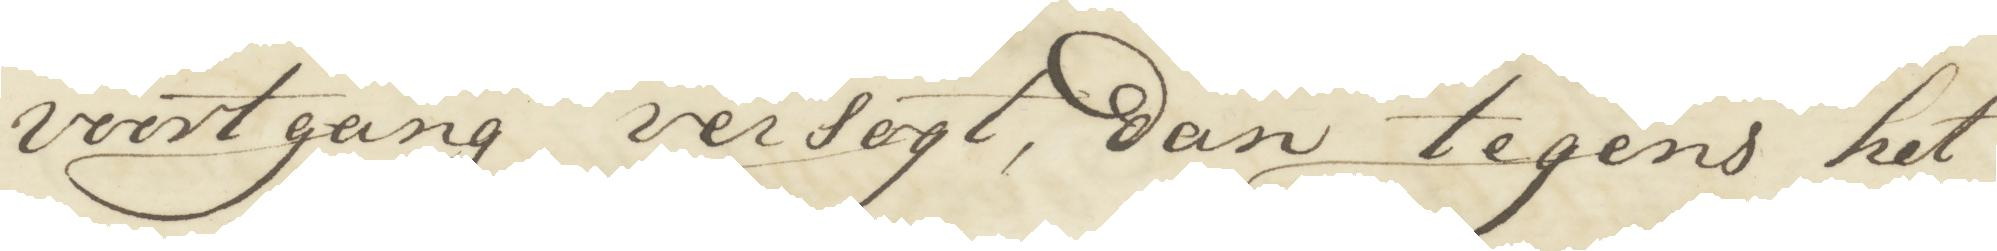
voortgang versogt, dan tegens het
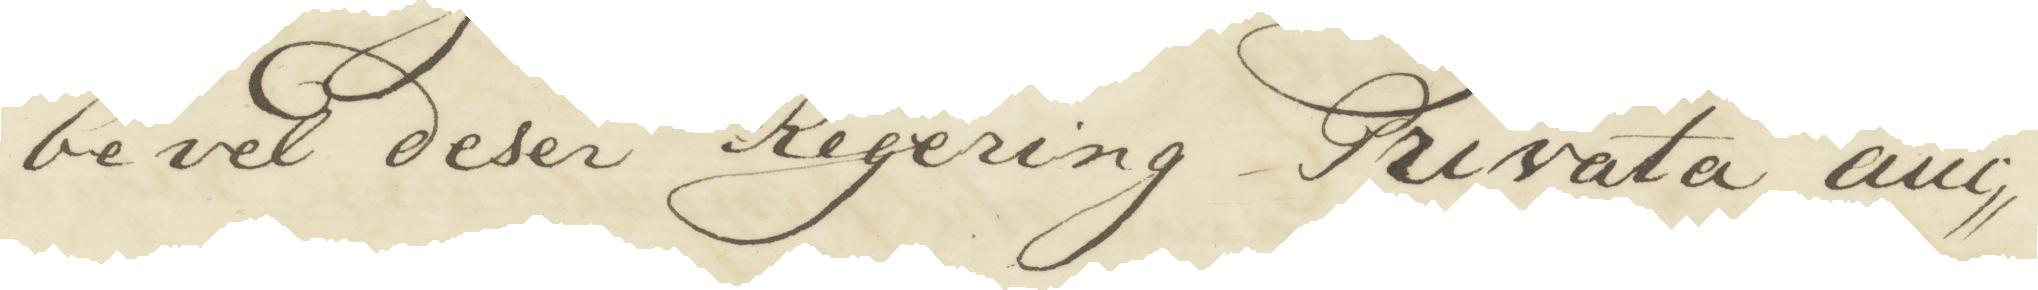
bevel deser Regering Privata auc„
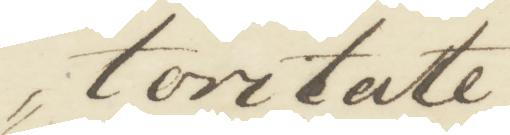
„toritate
